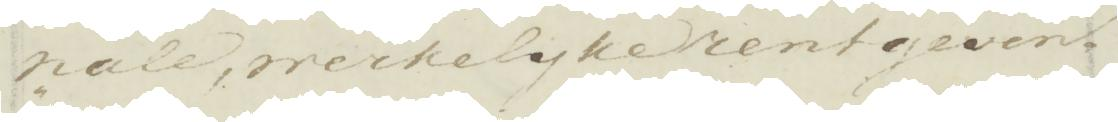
„nale, werkelyke rentgeven„
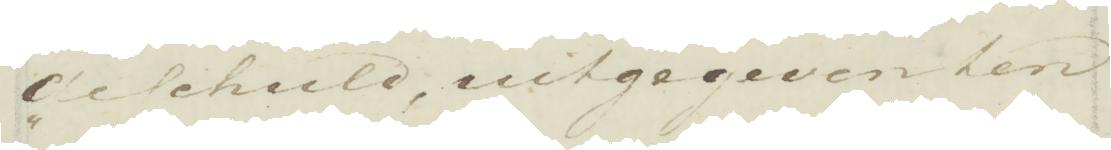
„de schuld, uitgegeven ten
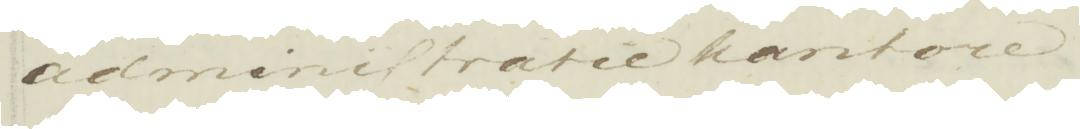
administratie kantore
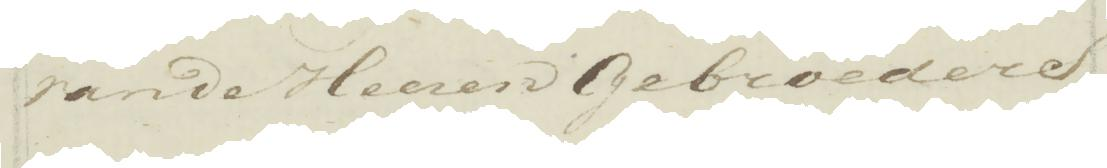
vande Heeren Gebroeders
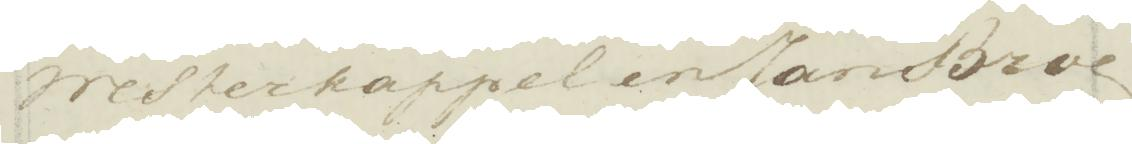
Westerkappel enJanBroe
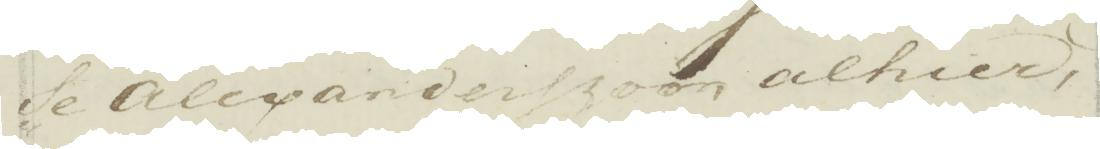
„se alexanderszoon alhier,
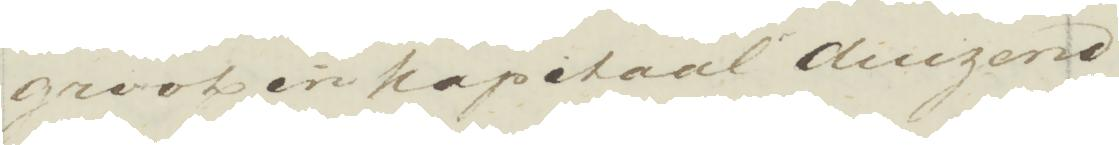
groot in kapitaal duizend
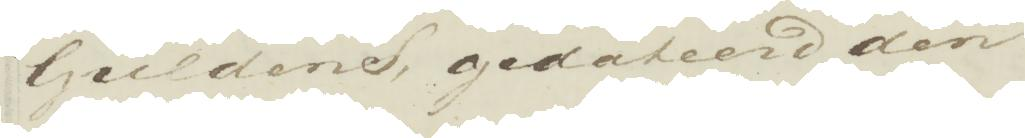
Guldens, gedateerd den
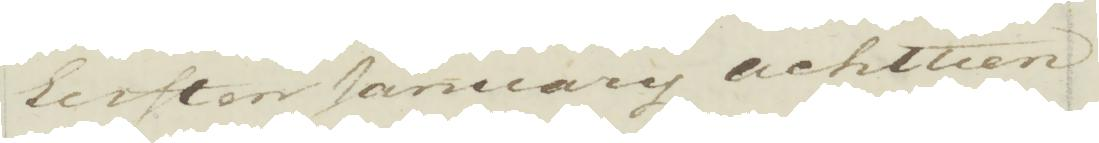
Eersten January achttien
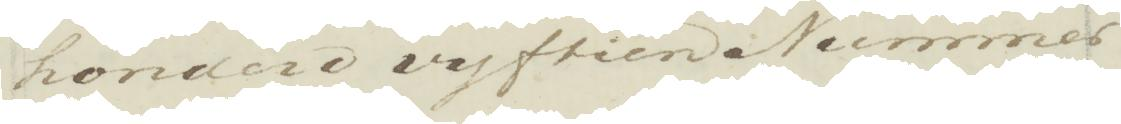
honderd vyftien Nummer
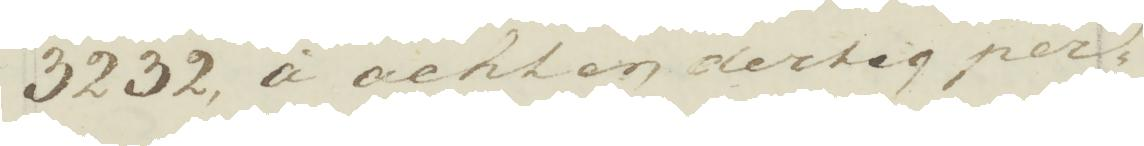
3232. à acht en dertig per„
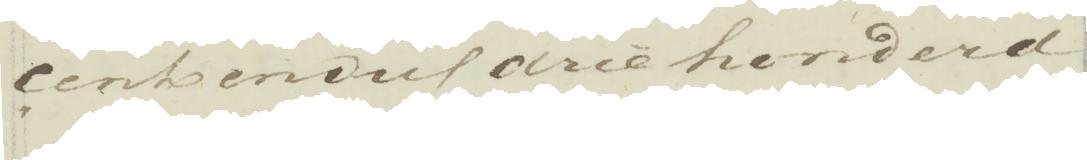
„cent endus drie honderd
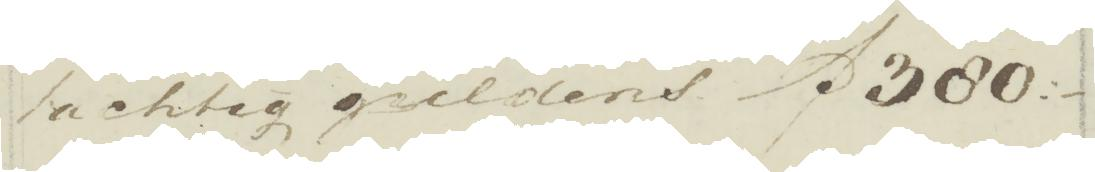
tachtig guldens ƒ 380:-
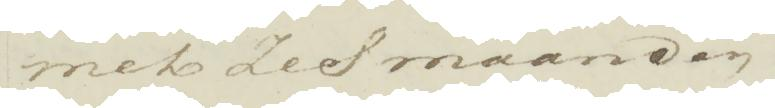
met zes maanden
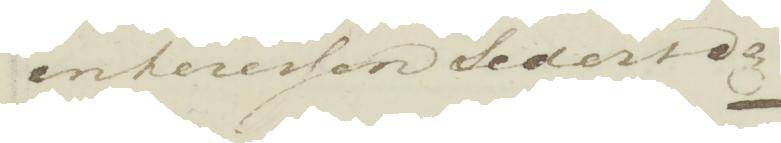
interessen sedert den
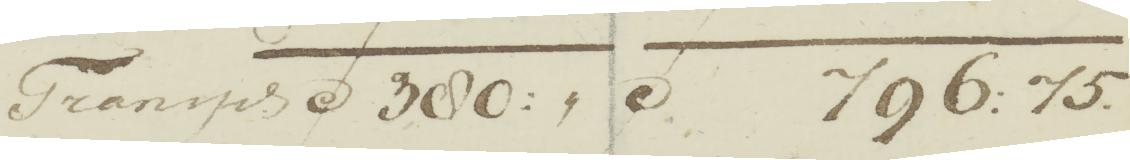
Transpt ƒ 380: „ ƒ 796: 75.
